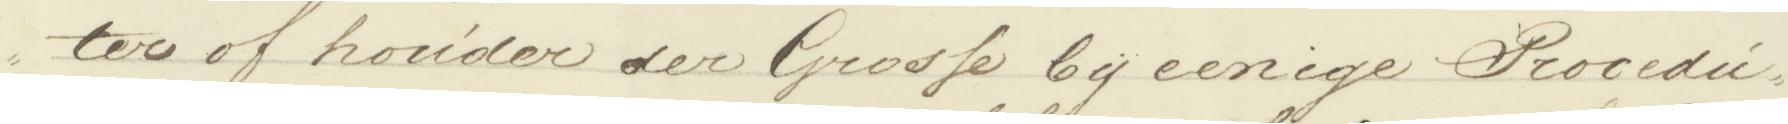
„ ter of houder der Grosse bij eenige Procedu„
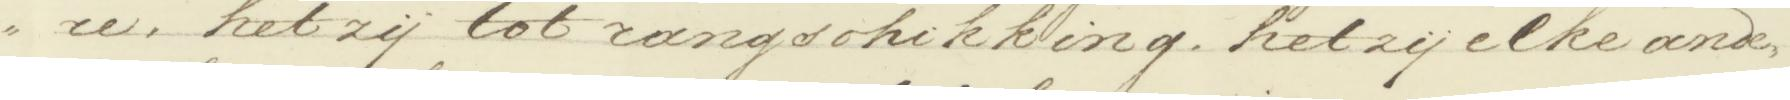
„ re, hetzij tot rangschikking, hetzij elke ande„
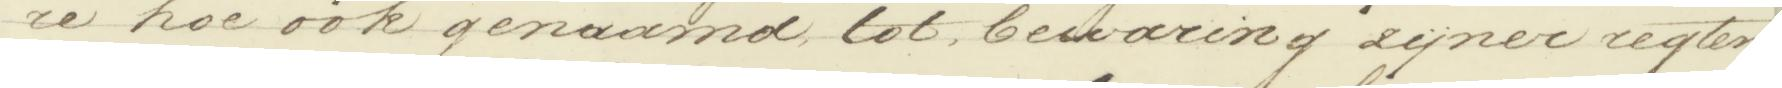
re hoe ook genaamd, tot, bewaring zijner regten
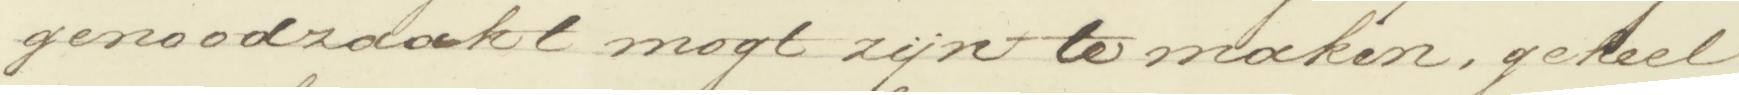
genoodzaakt mogt zijn te maken, geheel
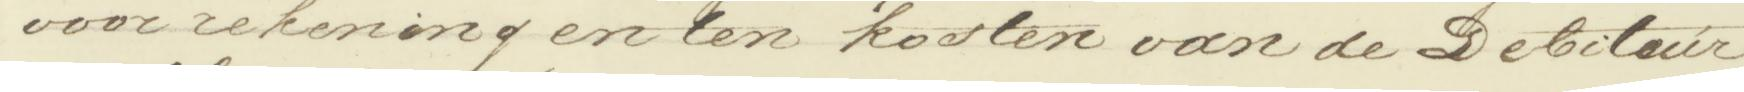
voor rekening en ten kosten van de Debiteur
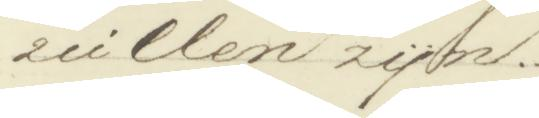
zullen zijn.
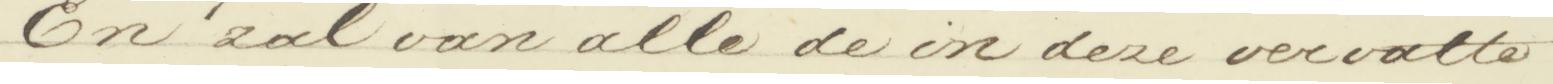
En zal van alle de in deze vervatte
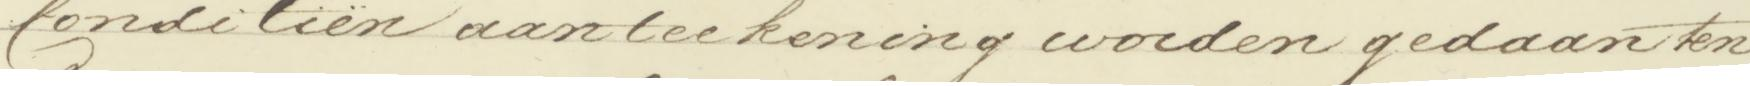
Conditiën aanteekening worden gedaan ten
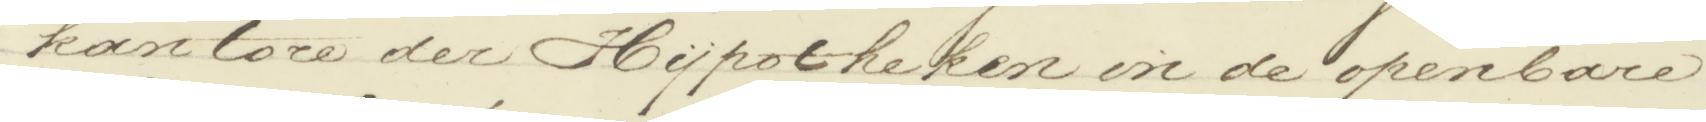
kantore der Hijpotheken in de openbare
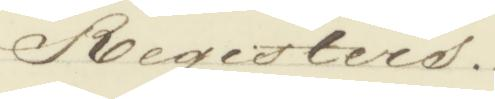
Registers.
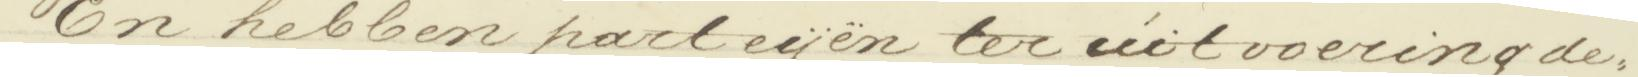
En hebben parteijen ter uitvoering de„
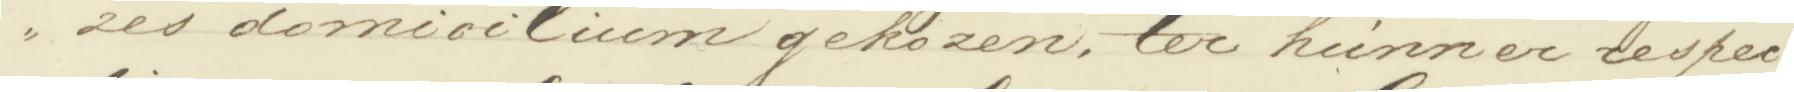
„ zes domicilium gekozen, ter hunner respec
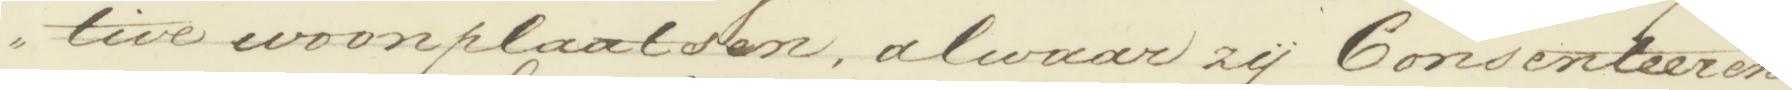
„ tive woonplaatsen, alwaar zij Consenteeren
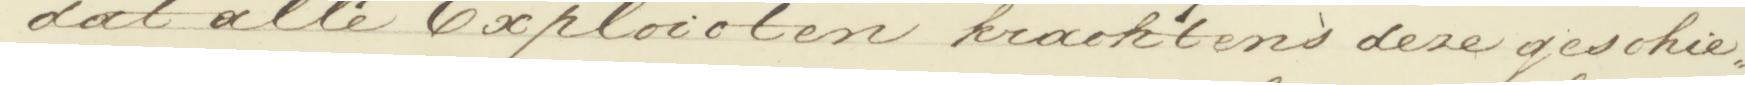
dat alle Exploicten krachtens deze geschie„
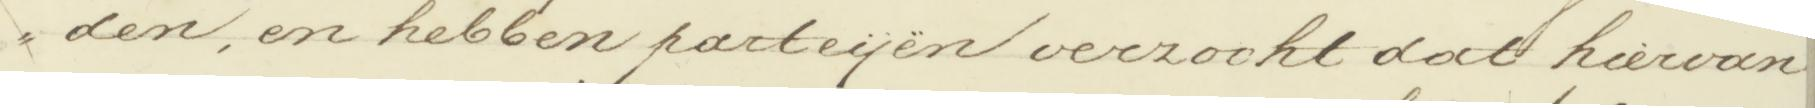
„den, en hebben parteijen verzocht dat hiervan
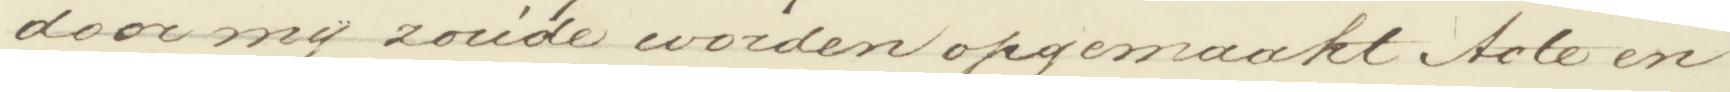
door mij zoude worden opgemaakt Acte en
